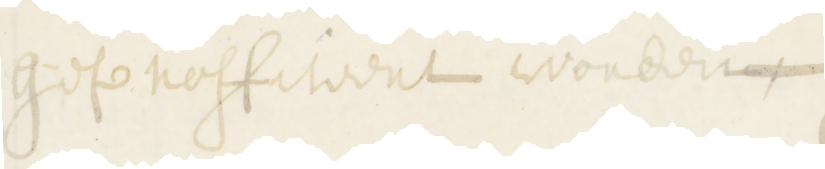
geproffiteert worden,
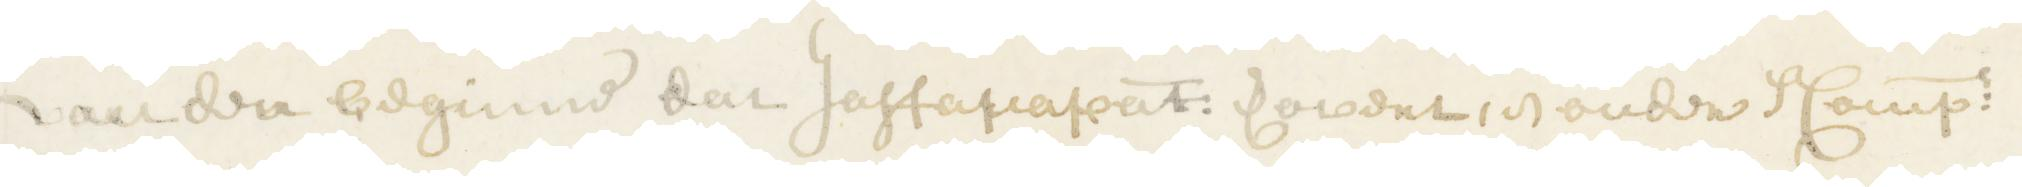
van den beginne dat Jaffanapat: verovert, en onder ’s Comp:s
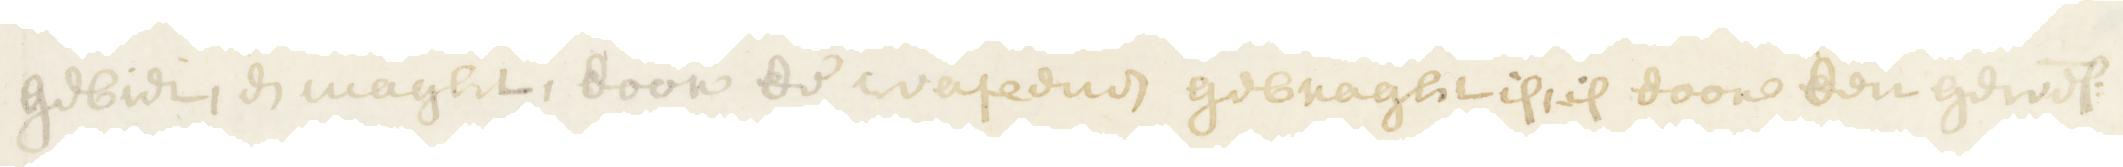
gebien, en maght, door de wapenen gebraght is, is door den gewes:
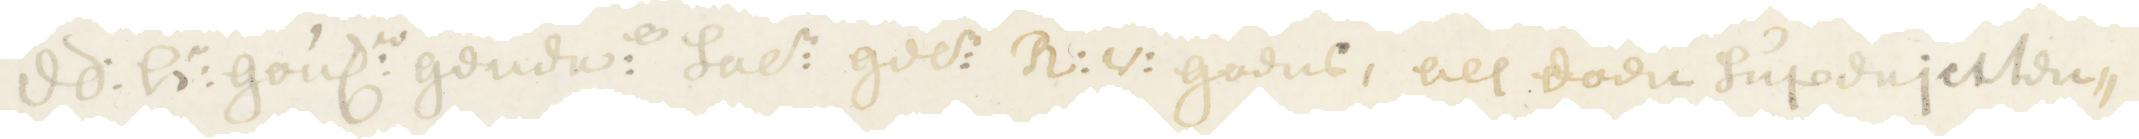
Ed: H:r gouver:r gener:l salijk gelijk R: v: goens, als doen superjetten„
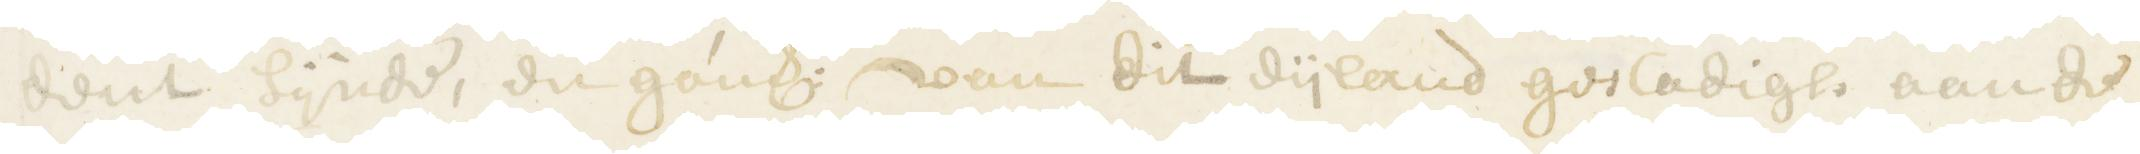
dent sijnde, en gouver:r van dit eijland gestadigh aan de
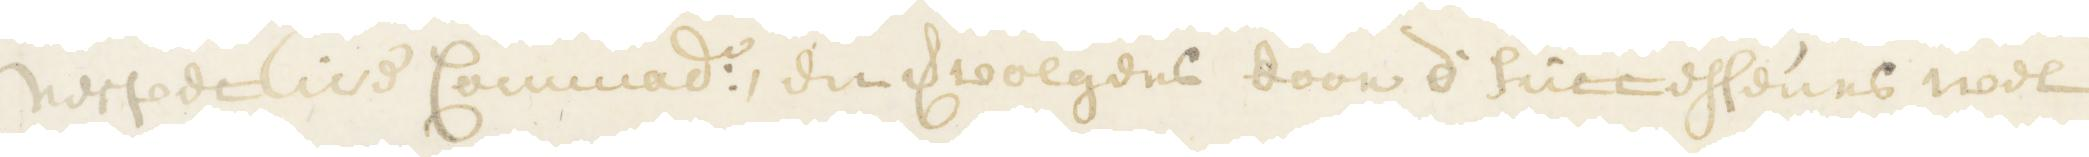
respective Commad:r, en vervolgens door d’ successeurs wel
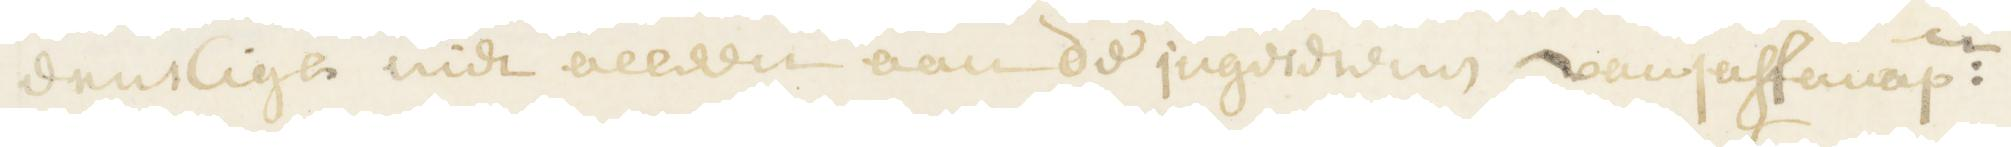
ernstigh niet alleen aan de jngesetenen van jaffanap:
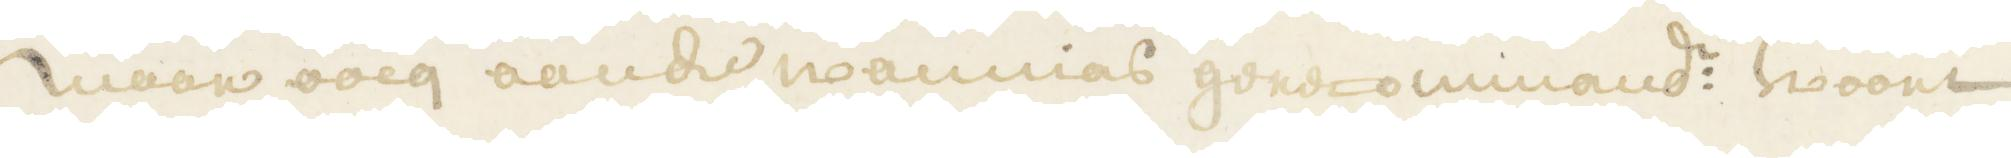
maar oocq aande wannias gerecommand:r tvoort
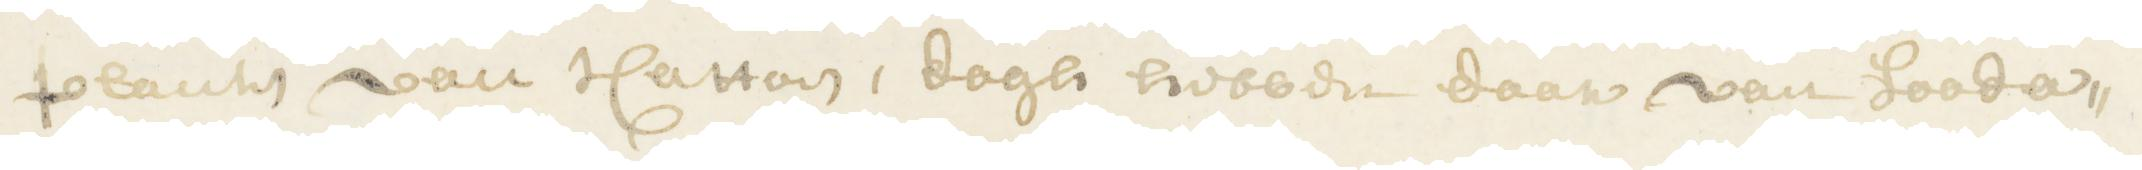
planten van tCattoen, dogh hebben daar van sooda„
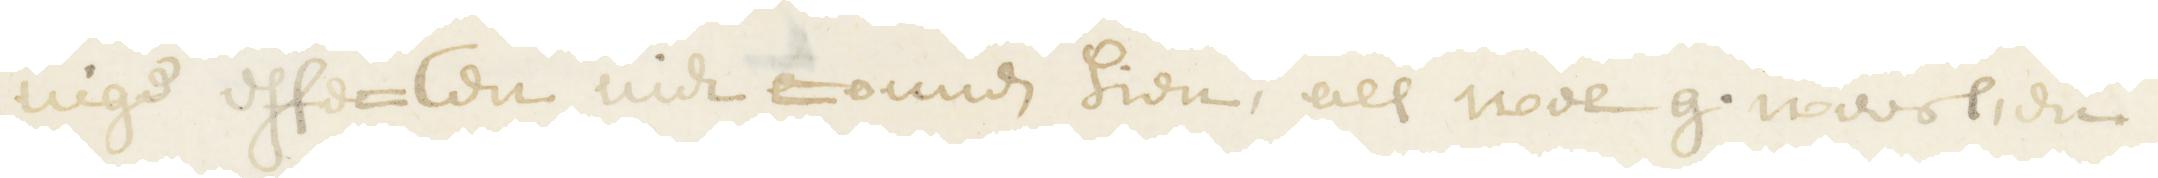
nige effecten niet connen sien, als wel g' weest, en
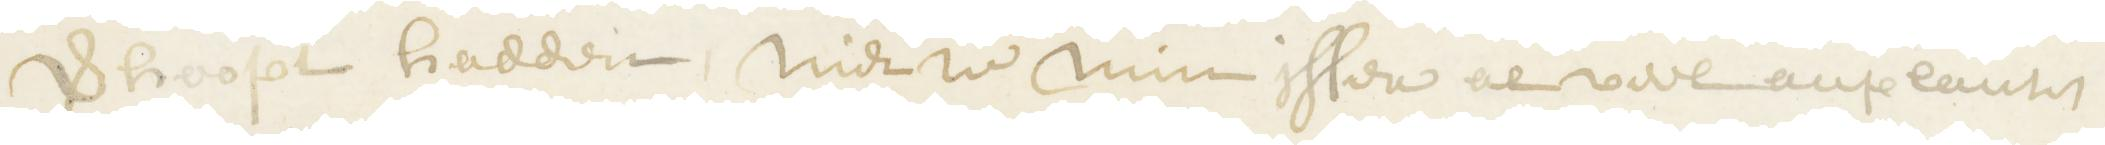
verhoopt hadden, niet te min isser alveel anplanten
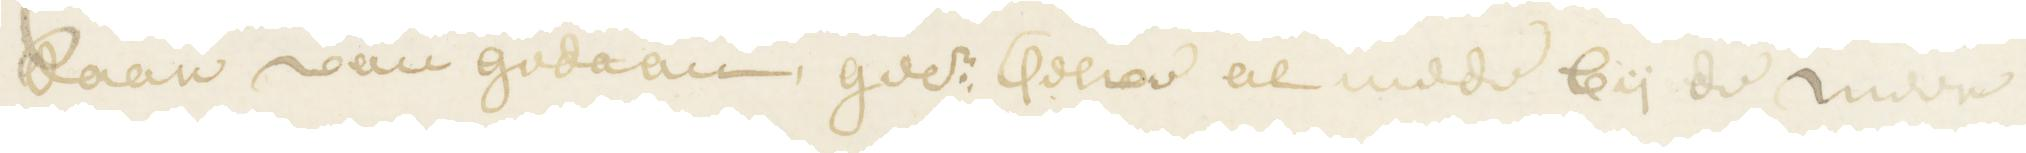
daar van gedaan, gelijk tselve al mede bij de meer
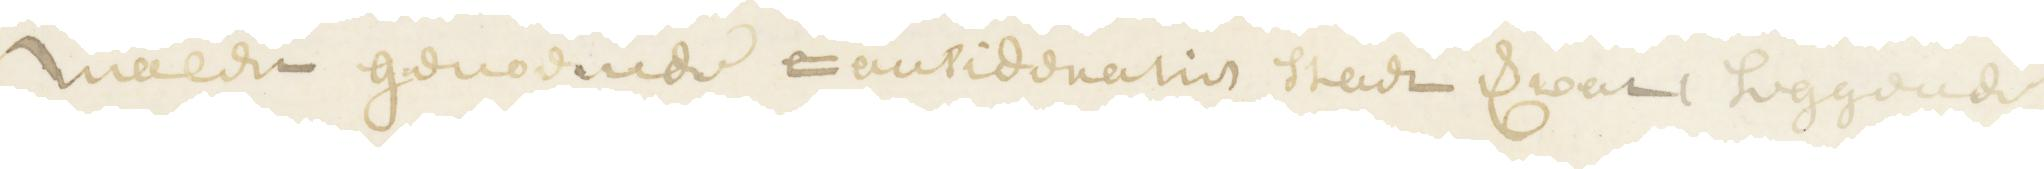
malen genoemde consideratie staet vervat, seggende
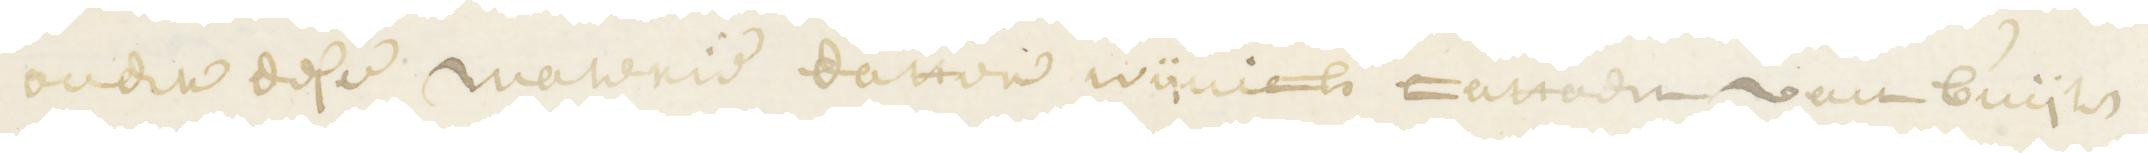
onder dese materie datter wijnich cattoen van buijten
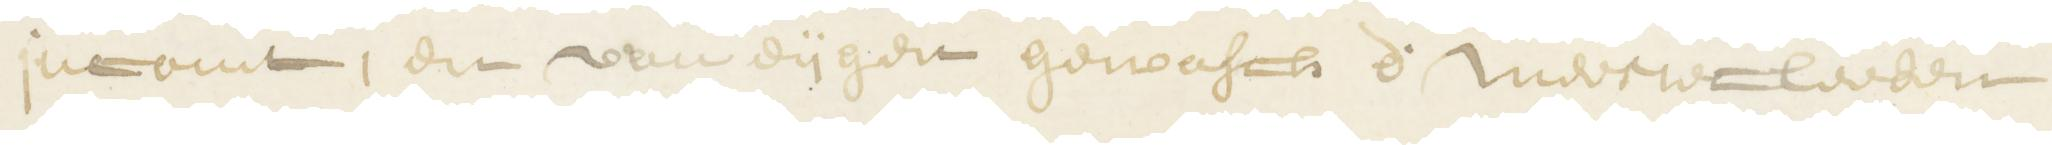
jncomt, en van eijgen gewasch d’ meestecleeden
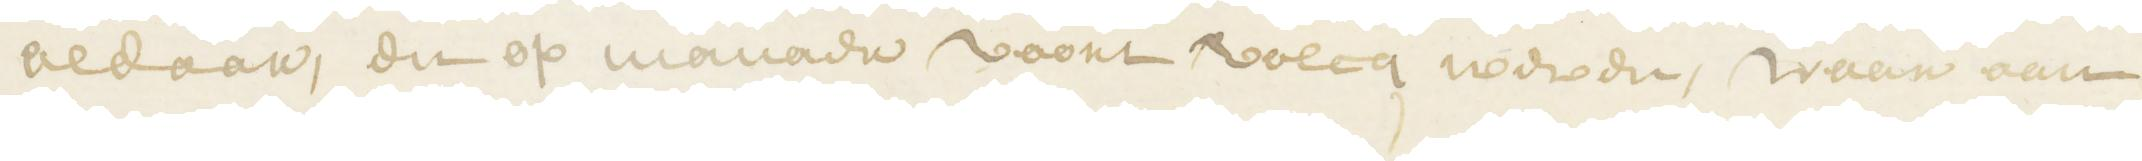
aldaar, en op manaer voort volcq weven, waar aan
